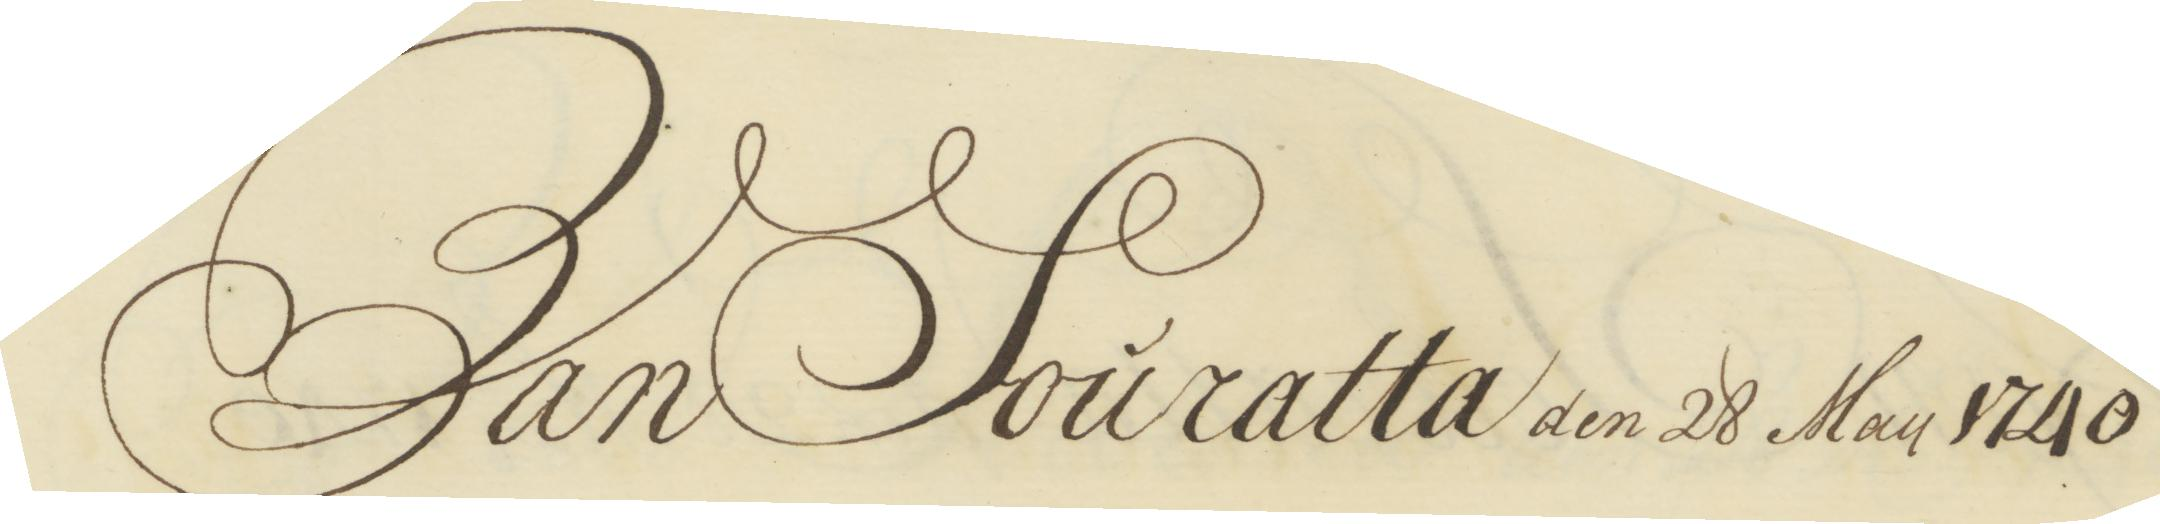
Van Souratta den 28 May 1740
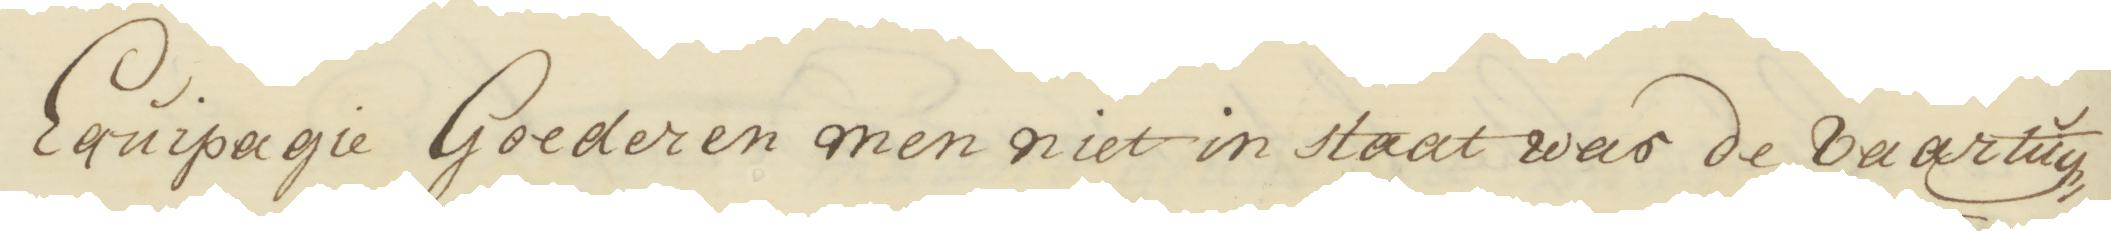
Equipagie Goederen men niet in staat was de vaartuij„
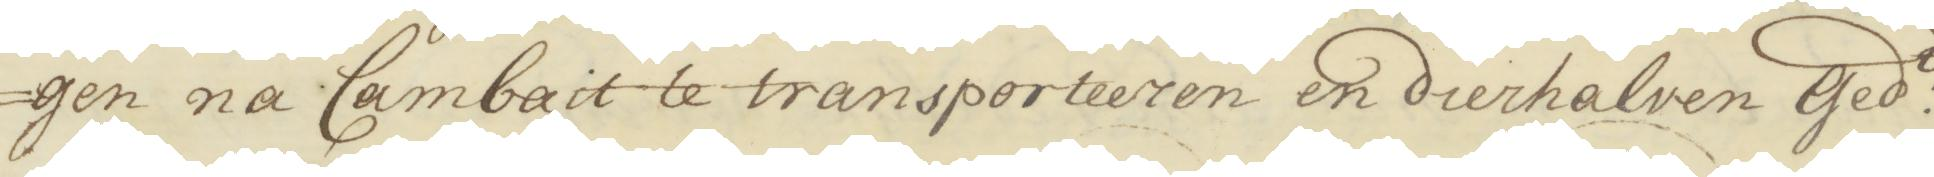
=gen na Cambait te transporteeren en dierhalven ged:te
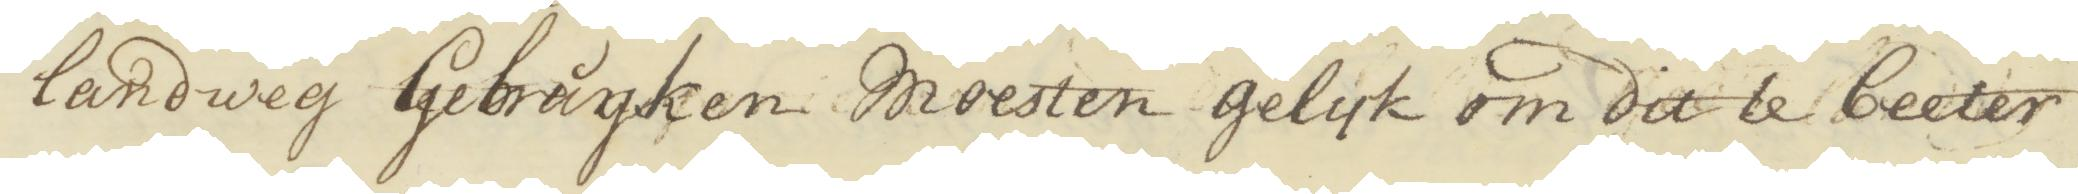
landweg Gebruyken Moesten gelyk om dit te beeter
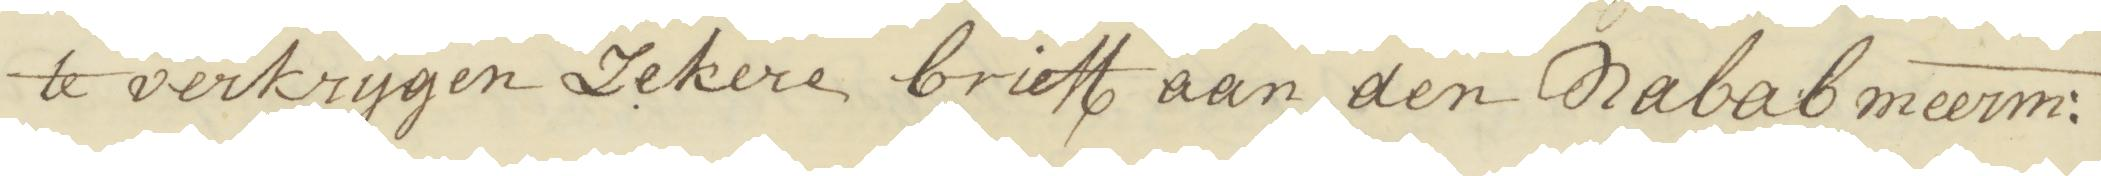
te verkrygen zekere brieff aan den Nabab meerm:
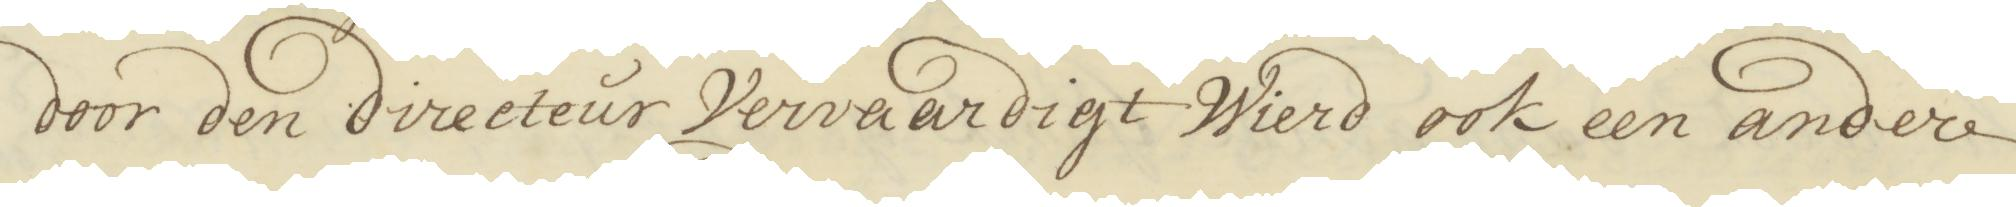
door den directeur Vervaardigt Wierd ook een andere
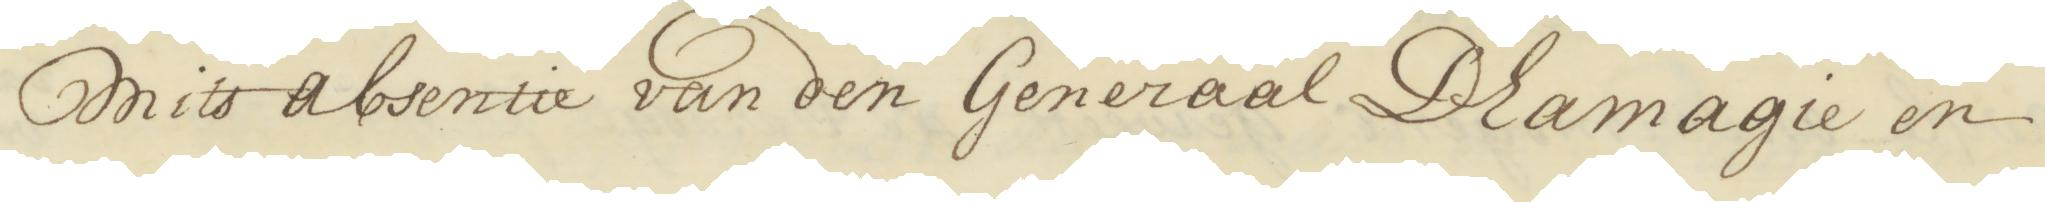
Mits absentie van den Generaal Dhamagie en
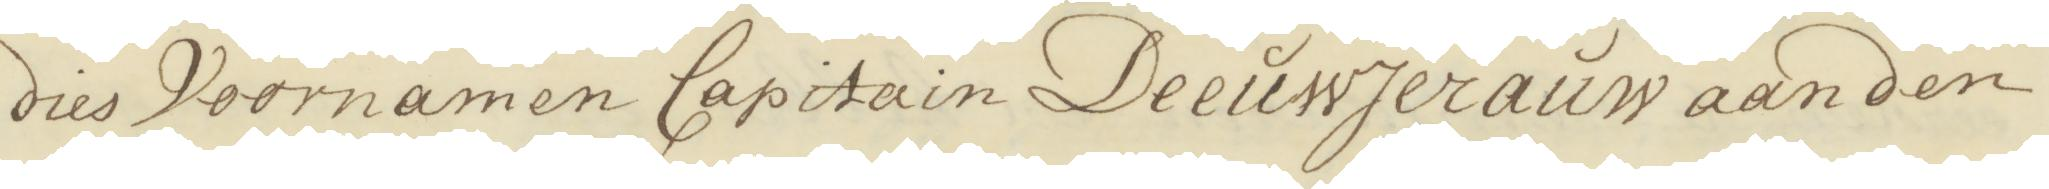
dies Voornamen Capitain Deeuwjerauw aan den
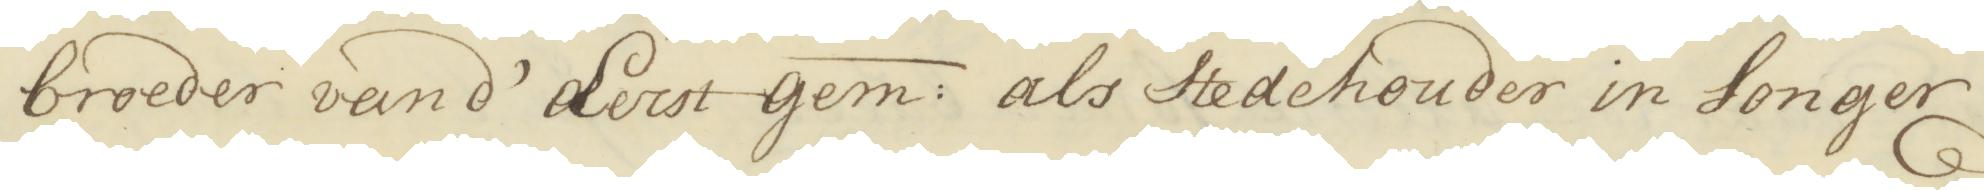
broeder van d’ Eerst gem: als stedehouder in songer
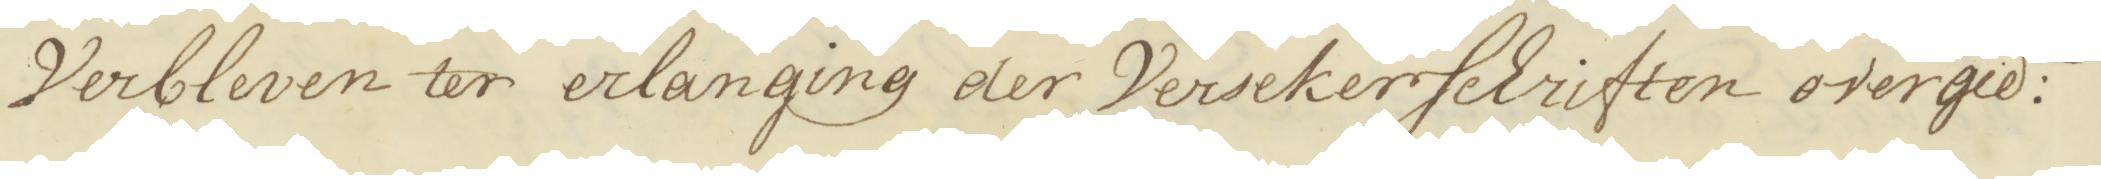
Verbleven ter erlanging der Versekerschriften overgie:te
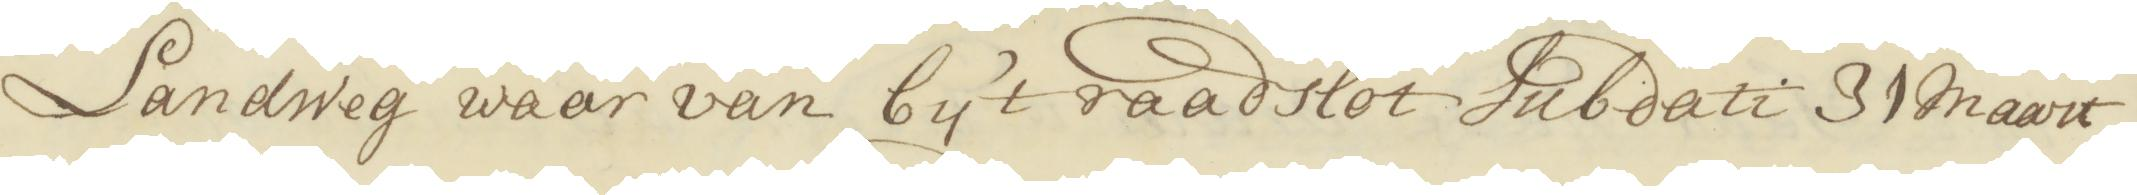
Landweg waar van by ’t raadslot subdati 31 Maart
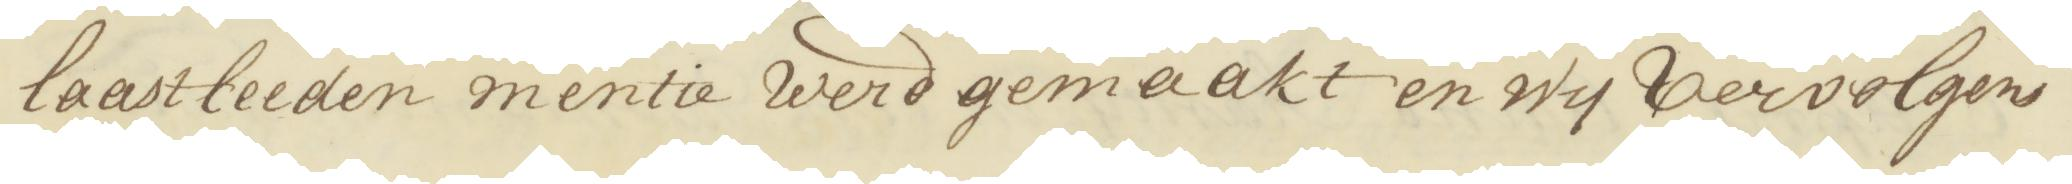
laastleeden mentie werd gemaakt en wy Vervolgens
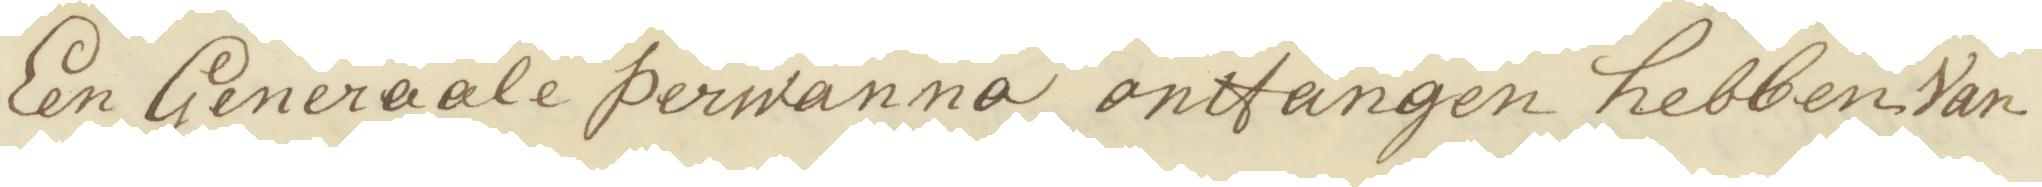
Een Generaale Perwanna ontfangen hebben Van
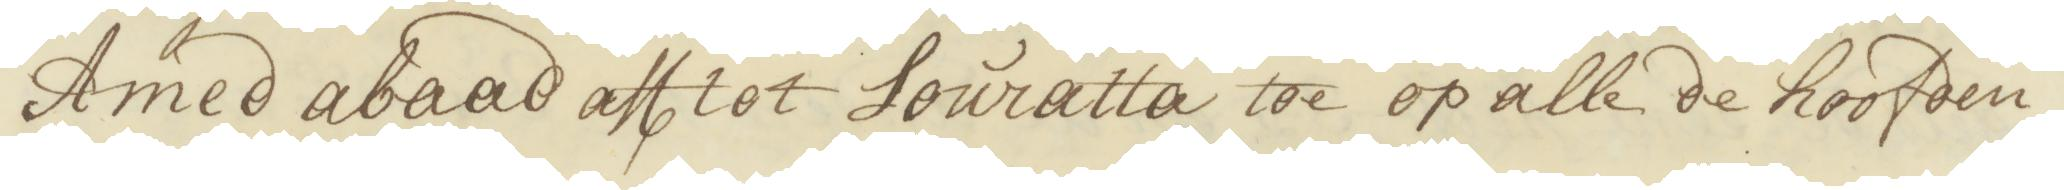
Amed abaad aff tot souratta toe op alle de hoofden
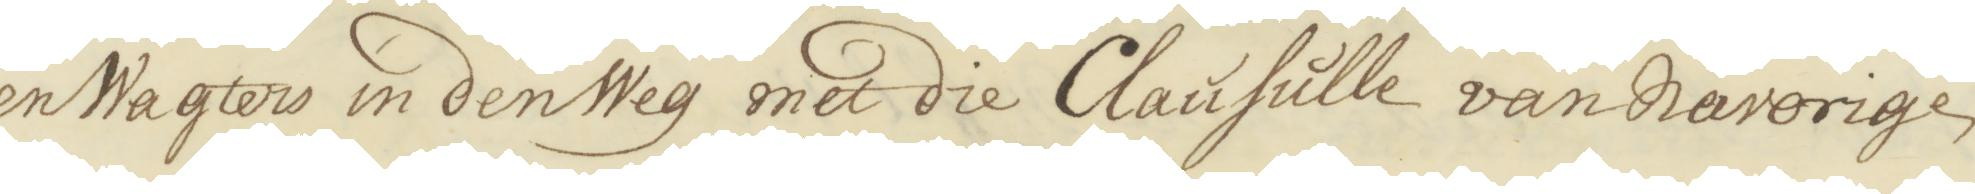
en Wagters in den Weg met die Clausulle van navorige
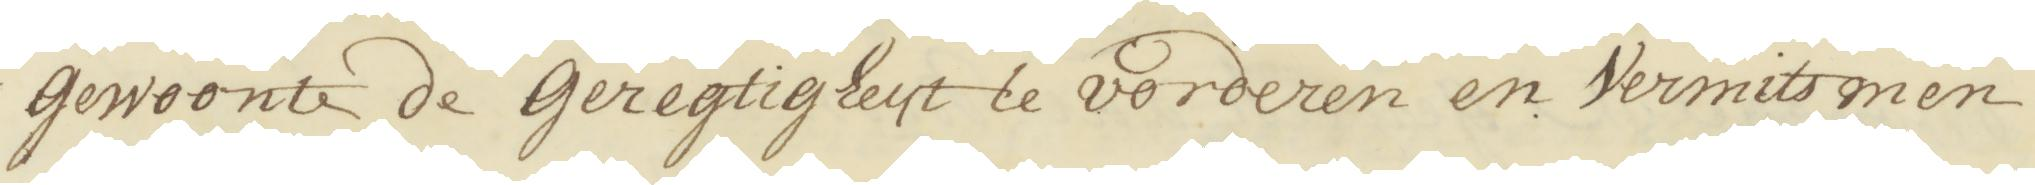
Gewoonte de Geregtigheyt te vorderen en Vermits men
